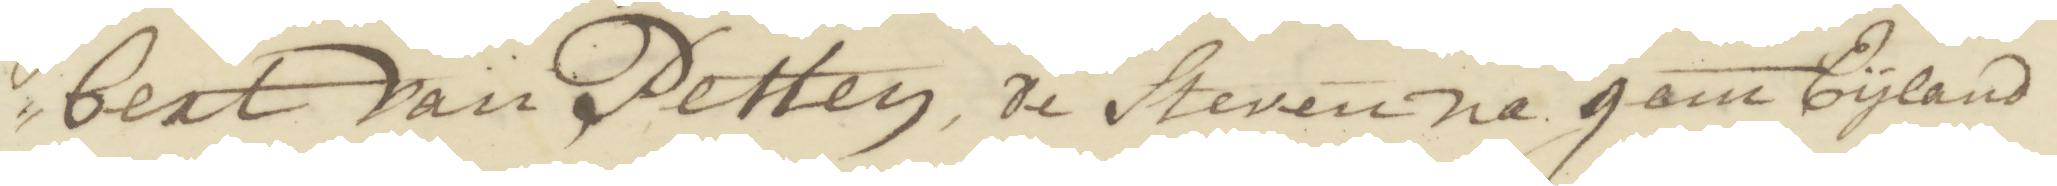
„bert van Petten, de steven na gem: Eijland
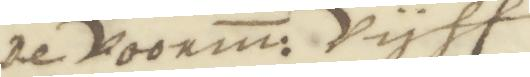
de voorm: vijff
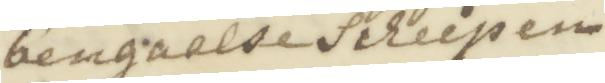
bengaalse scheepen
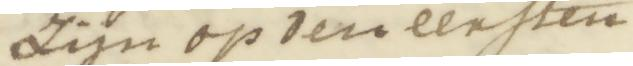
Zijn op den eersten
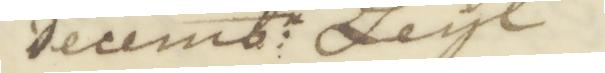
decemb:r Zeijl
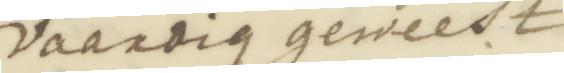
vaardig geweest
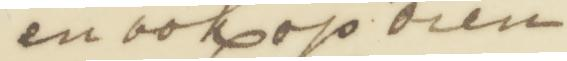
en ook op dien
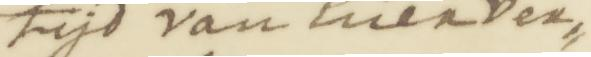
tijd van hier ver„
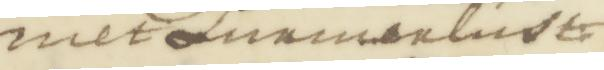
met Purmerlust
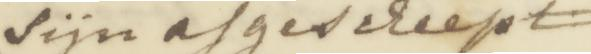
sijn afgescheept
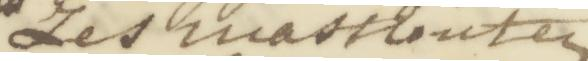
zes masthouten
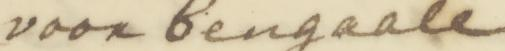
voor bengaale
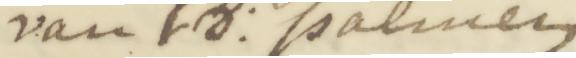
van 18: palmen
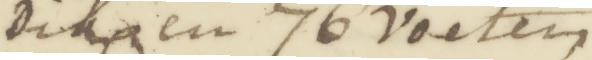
dik en 76 voeten
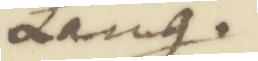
Lang.
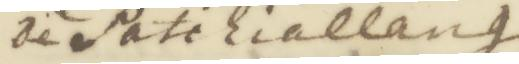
de Patchiallang
